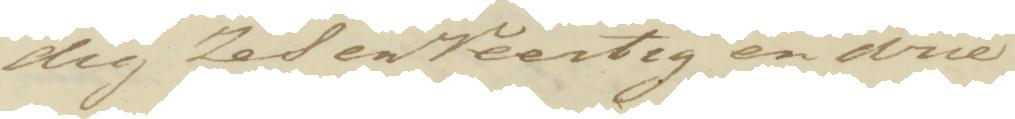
dig Zes en Veertig en drie
